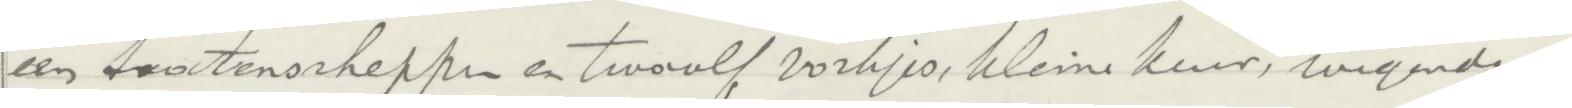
een taartenschepper en twaalf vorkjes, kleine keur, wegende
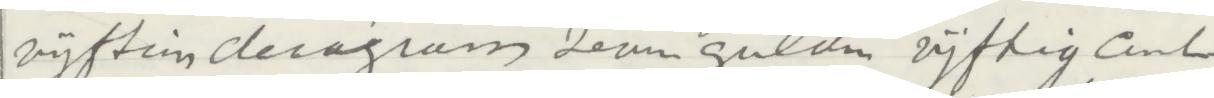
vijftien decagram zeven gulden vijftig cent
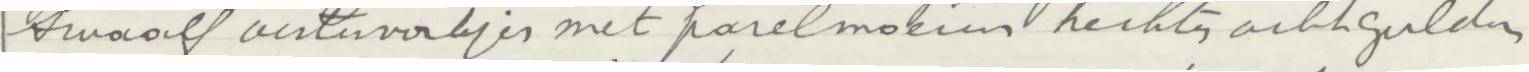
twaalf oestervorkjes met parelmoeren hechten acht gulden
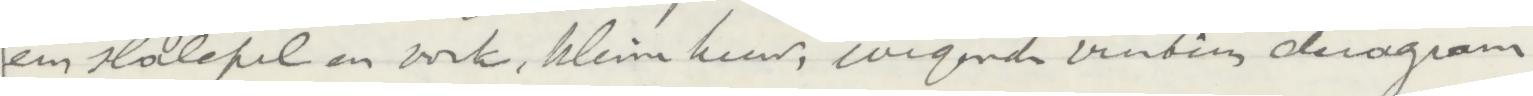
en slalepel en vork, kleine keur, wegende veertien decagram
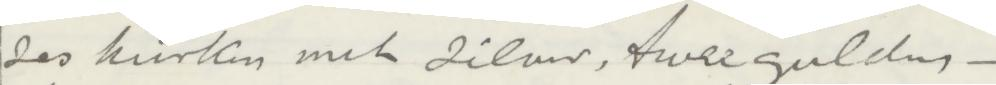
zes kurken met zilver, twee gulden
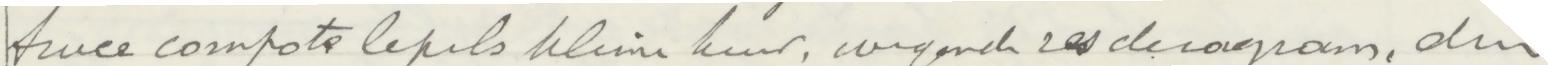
twee compote lepels kleine keur, wegende zes decagram, drie
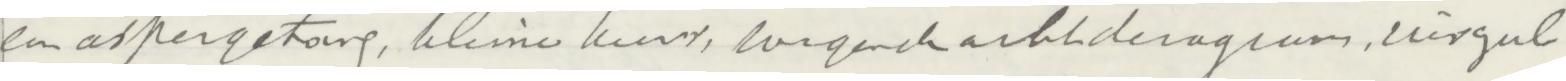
een aspergetang, kleine keur, wegende acht decagram, vier gul
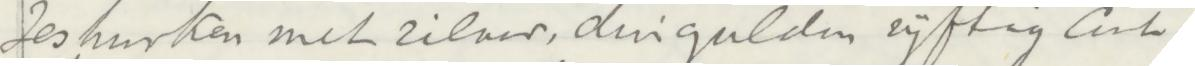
zes kurken met zilver, drie gulden vijftig Cents
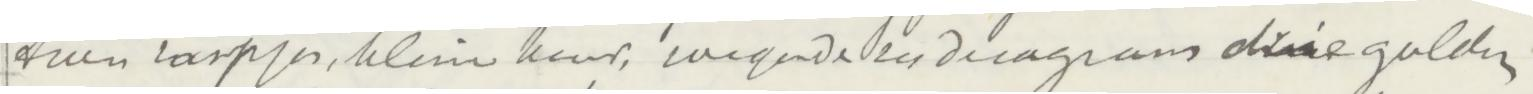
tien raspjes, kleine keur, wegende zes decagram drie gulden
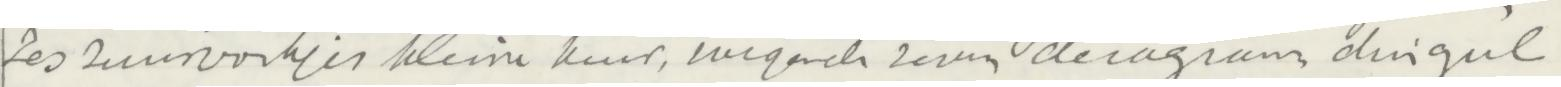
zes zuurvorkjes in kleine keur, wegende zeven decagram drie gul
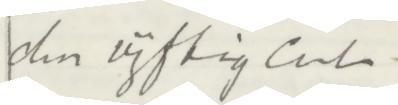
den vijftig Cent
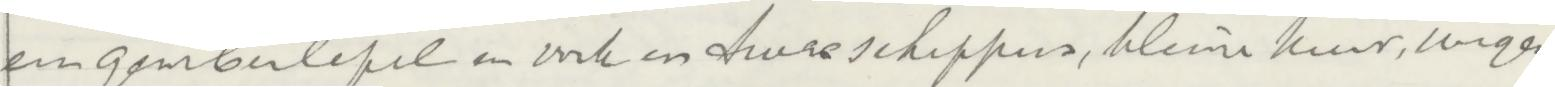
een gemberlepel en vork en twee scheppers, kleine keur, wegen
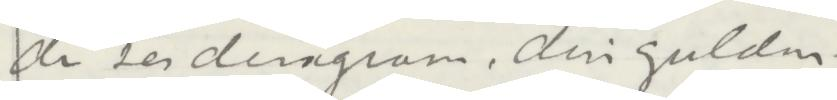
de zes decagram, drie gulden
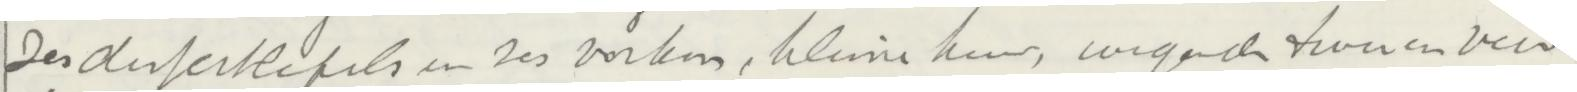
zes dessertlepels en zes vorken, kleine keur, wegede twee en veer
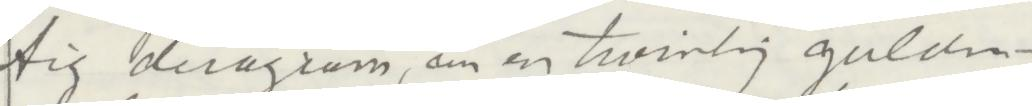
tig decagram, een en twintig gulden
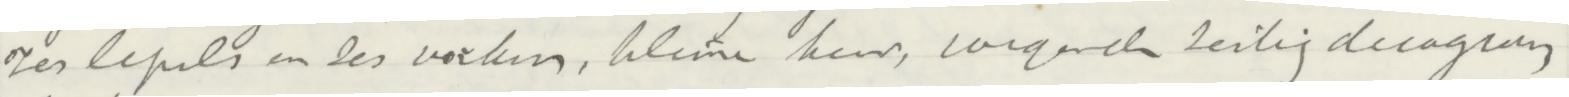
zes lepels en zes vorken, kleine keur, wegende zestig decagram
